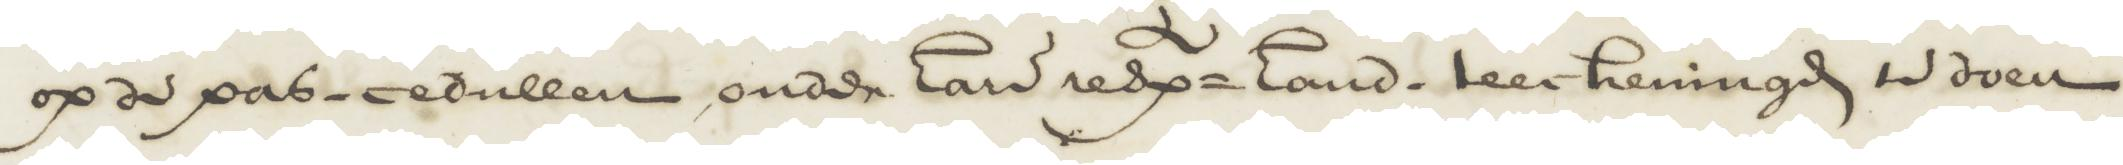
op de pas-cedullen, onder hare resp= hand-teeckeningen te doen
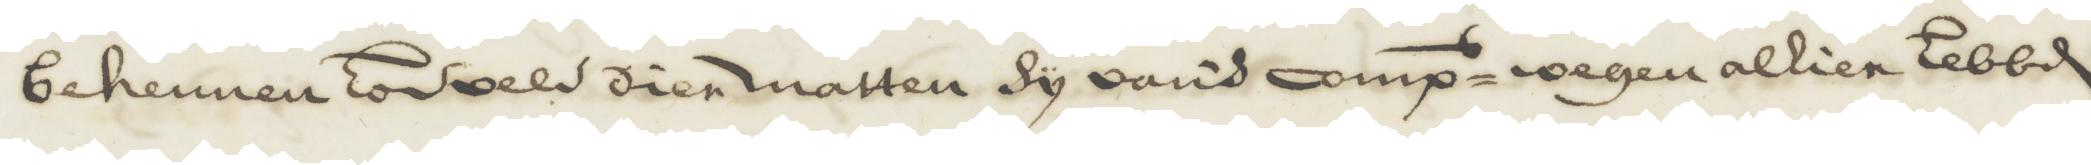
bekennen hoevele dier matten sij van’s comp=s wegen alhier hebben
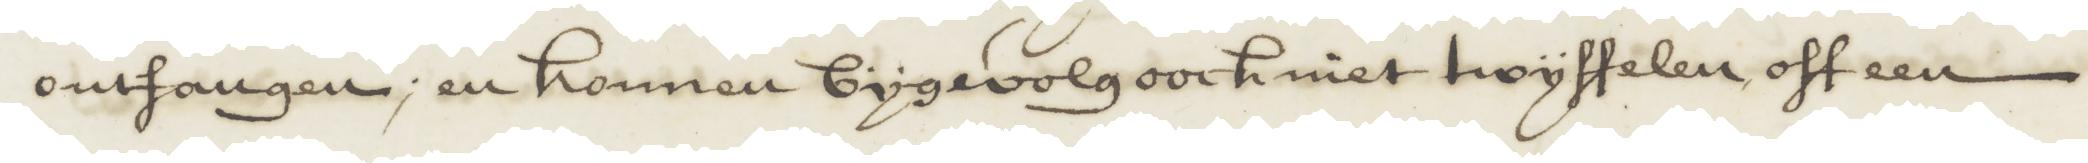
ontfangen; en konnen bijgevolg oock niet twijffelen off een
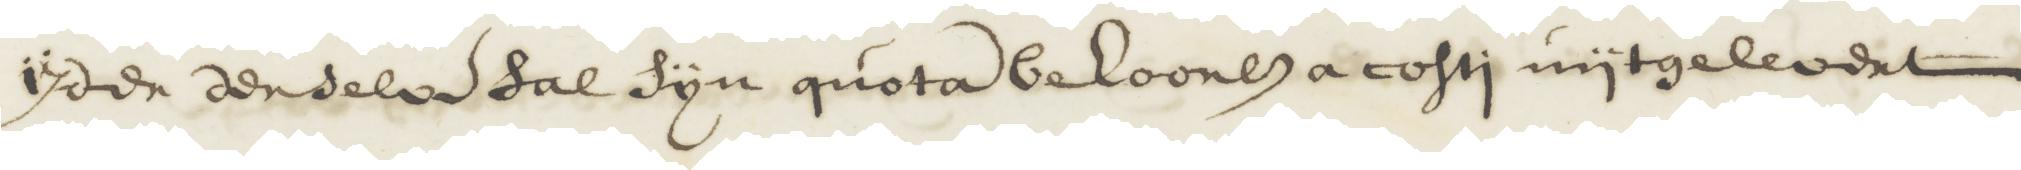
ijder derselve sal sijn quota behoorlijk a costj uijtgelevert
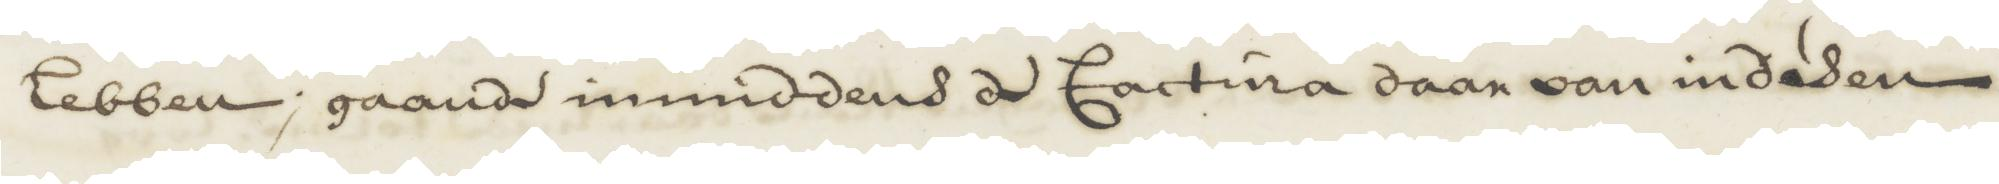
hebben; gaande inmiddens de factura daar van in desen
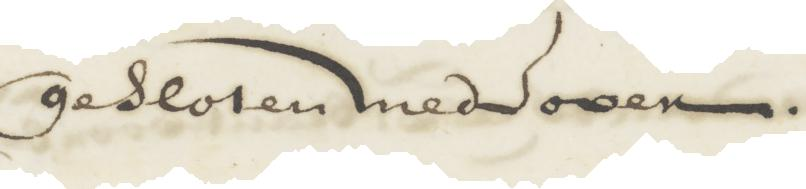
gesloten mede over.
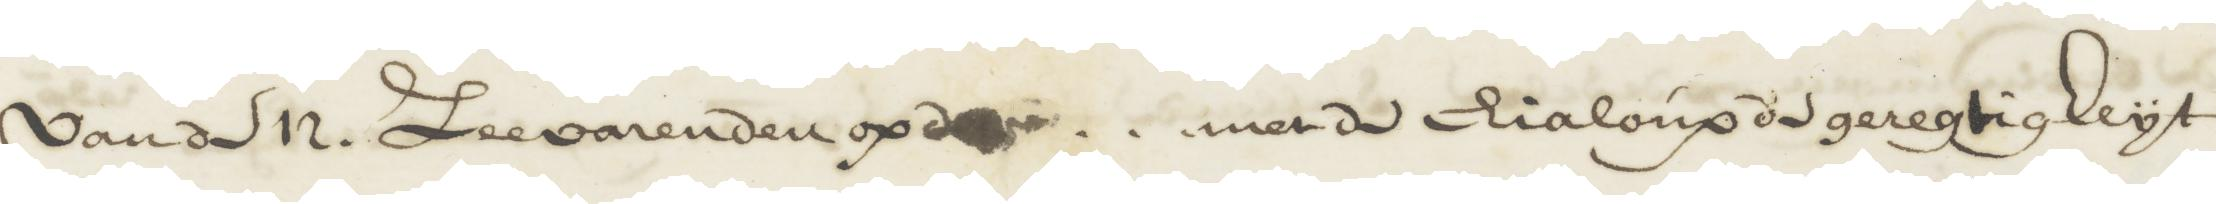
Van de 12. Zeevarenden op de . . met de chialoup de geregtigheijt
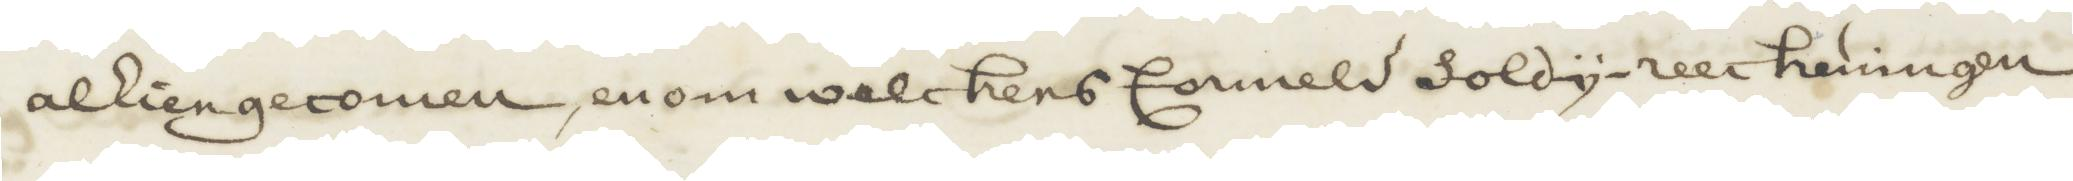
alhier gecomen, en om welckers formele soldij-reeckeningen
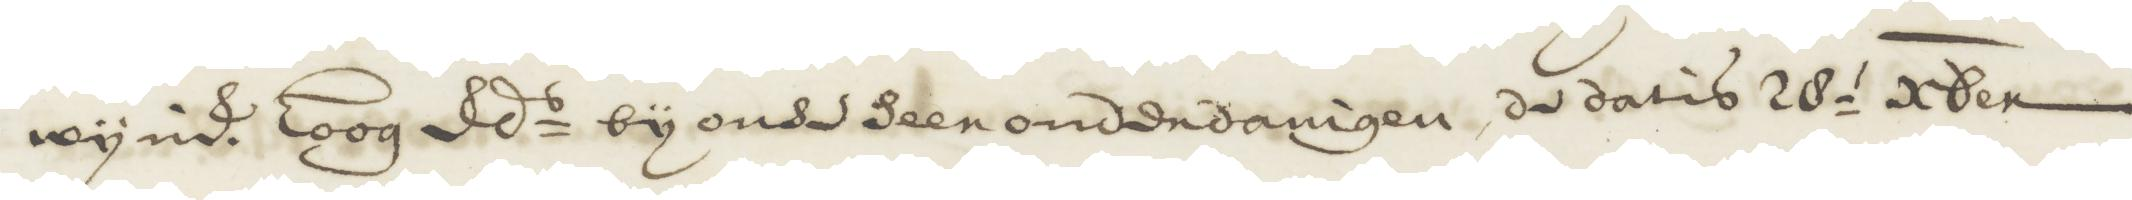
wij uE. hoog Ed=s bij onse seer onderdanigen, de datis 28=' xber
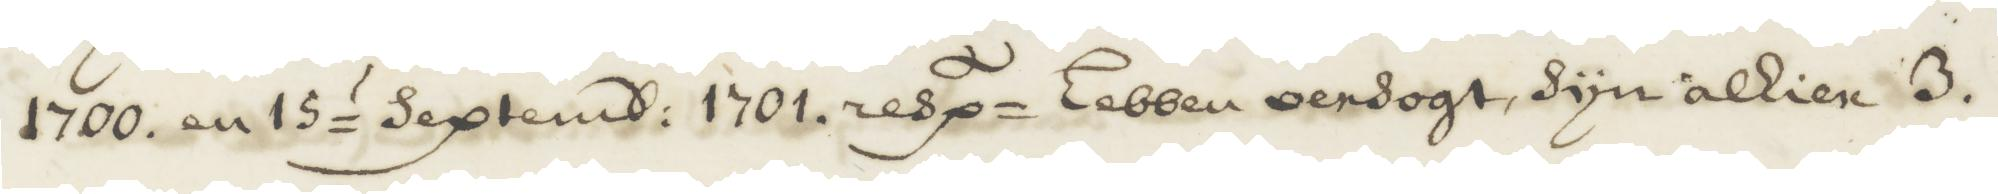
1700. en 15=' Septemb: 1701. resp= hebben versogt, sijn alhier 3.
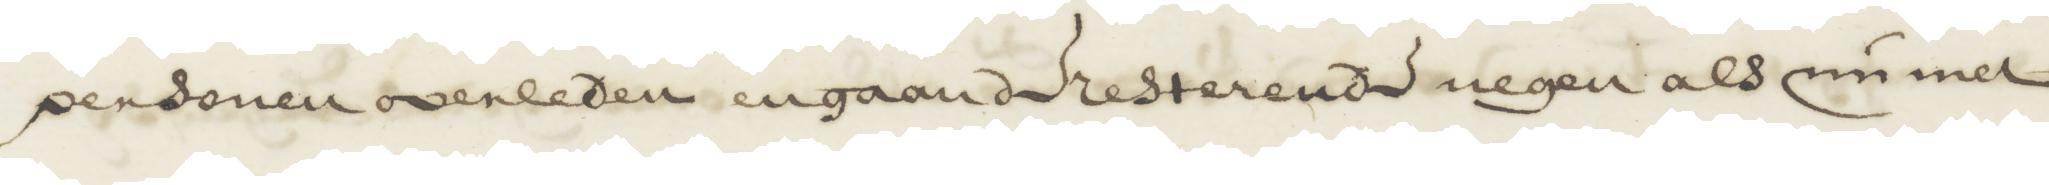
personen overleden en gaan de resterende negen als nu met
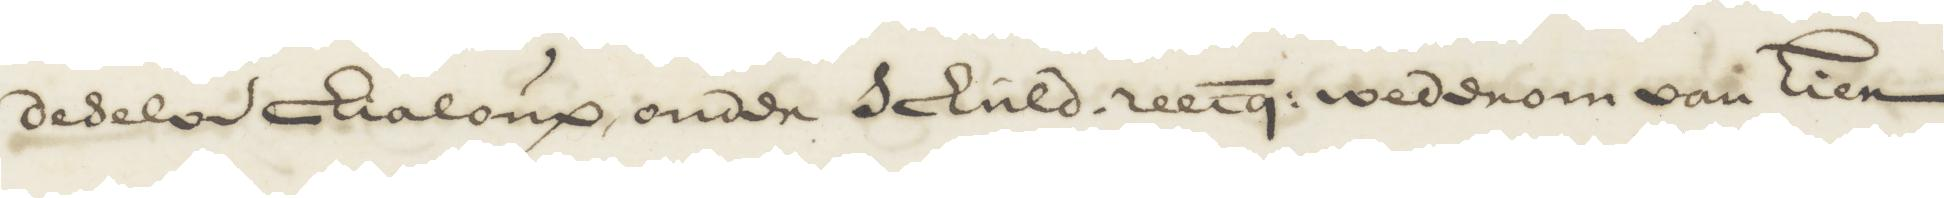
deselve chialoup, onder schuld-reecq: wederom van hier
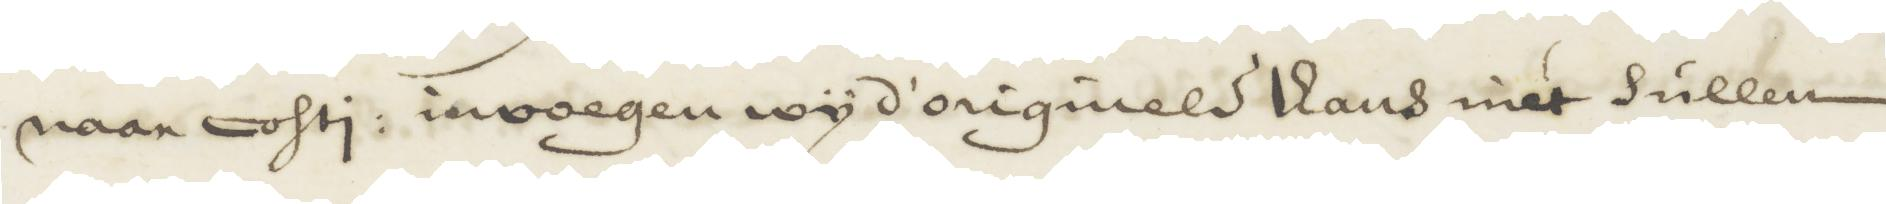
naar costj: invoegen wij d’originele thans niet sullen
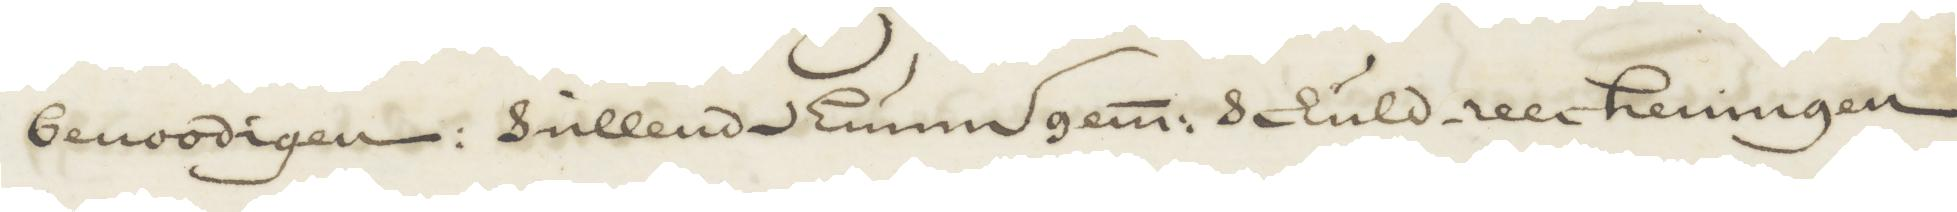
benoodigen: sullende hunne gem: schuld-reeckeningen
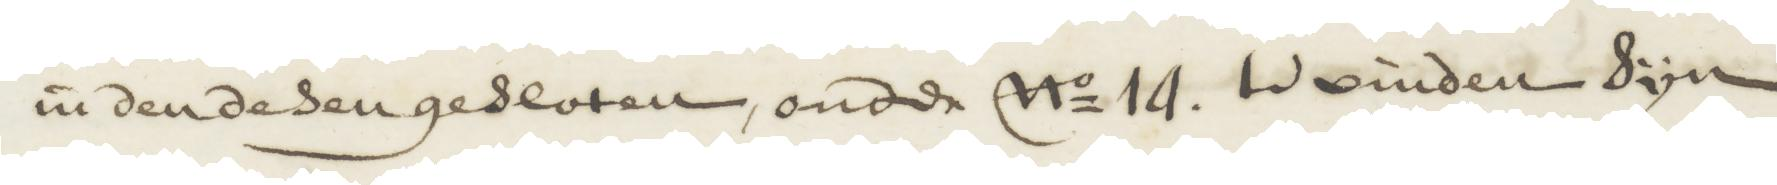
in den desen gesloten, onder N=o 14. te vinden sijn
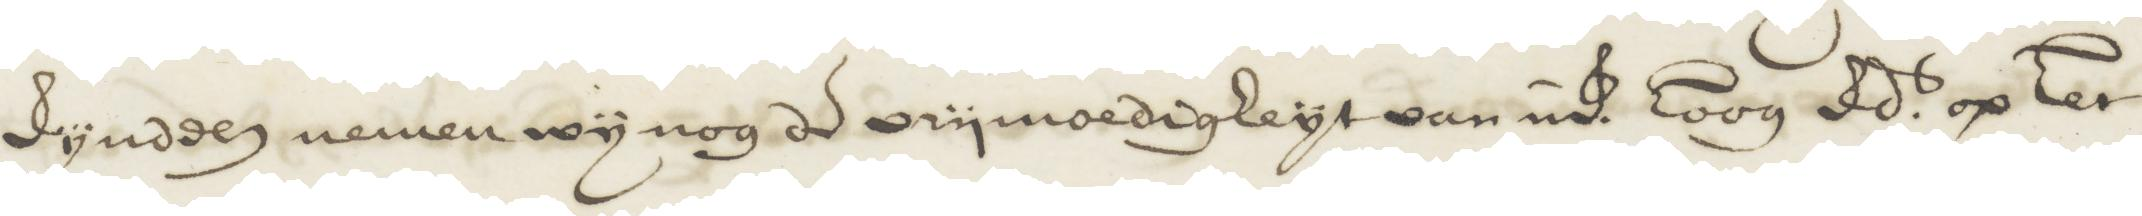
Eijndelijk nemen wij nog de vrijmoedigheijt van uE. hoog Ed.s op het
